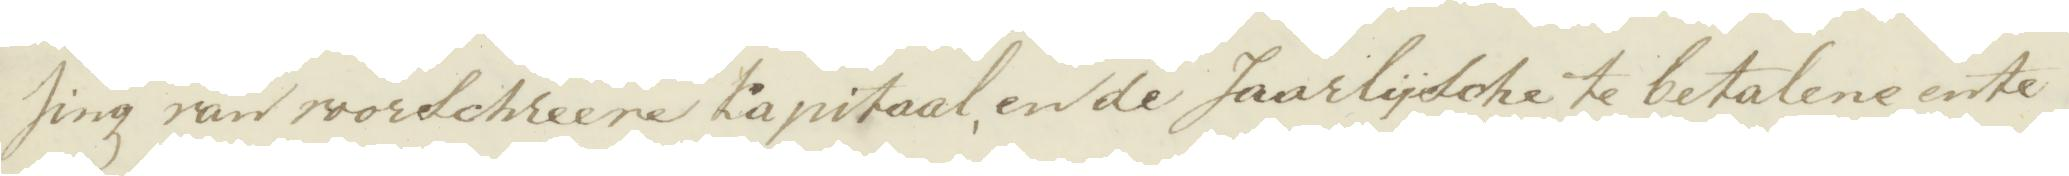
sing van voorschreeve kapitaal, en de Jaarlijsche te betalene en te
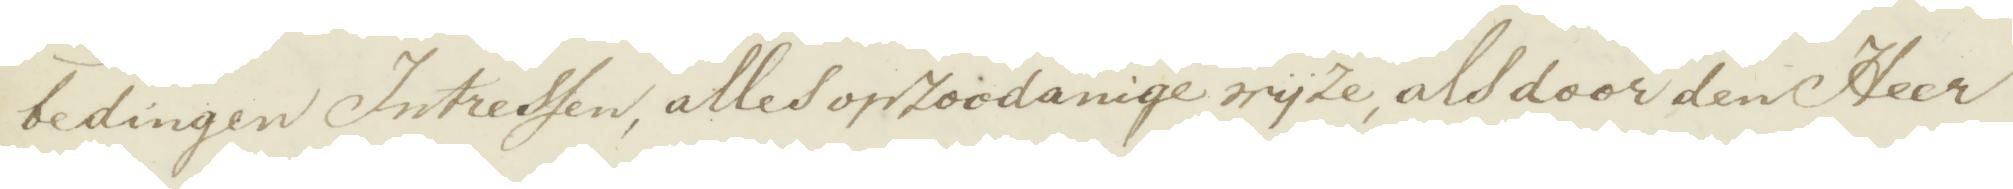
bedingen Jntressen, alles op zoodanige wijze, als door den Heer
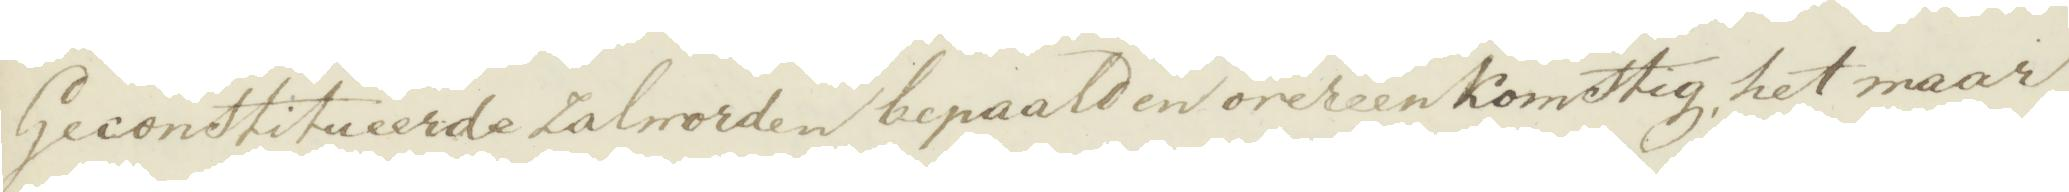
Geconstitueerde zal worden bepaald en overeenkomstig, het waar
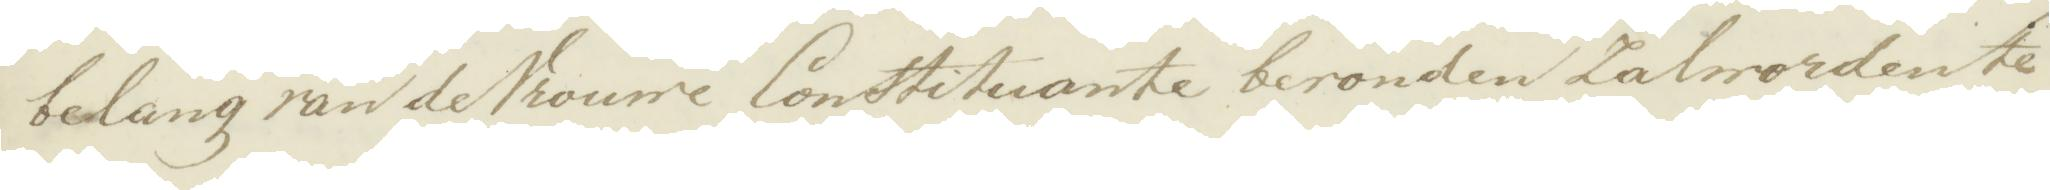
belang van de Vrouwe Constituante bevonden zal worden te
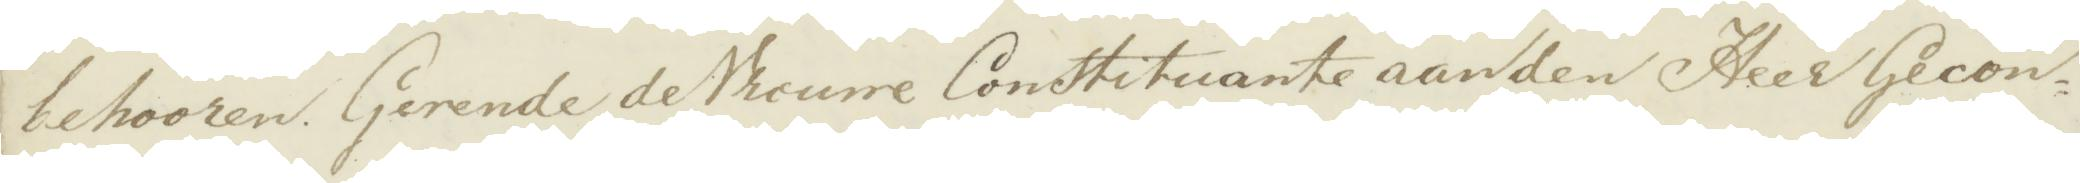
behooren. Gevende de Vrouwe Constituante aan den Heer gecon=
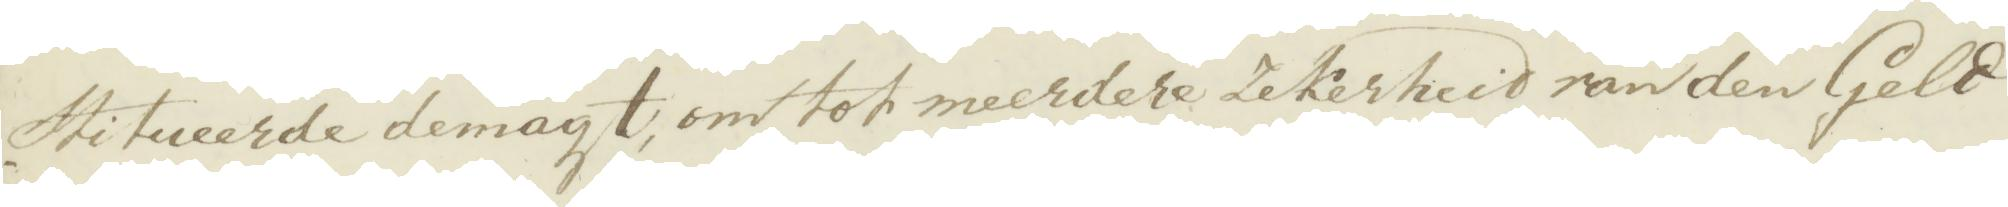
stitueerde demagt, om tot meerdere zekerheid van den Geld
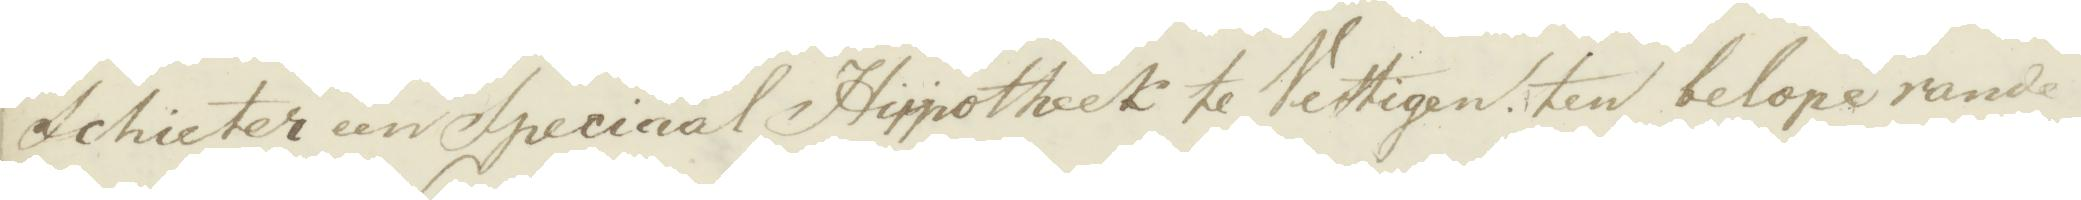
schieter een Speciaal Hijpotheek te Vestigen, ten belope van de
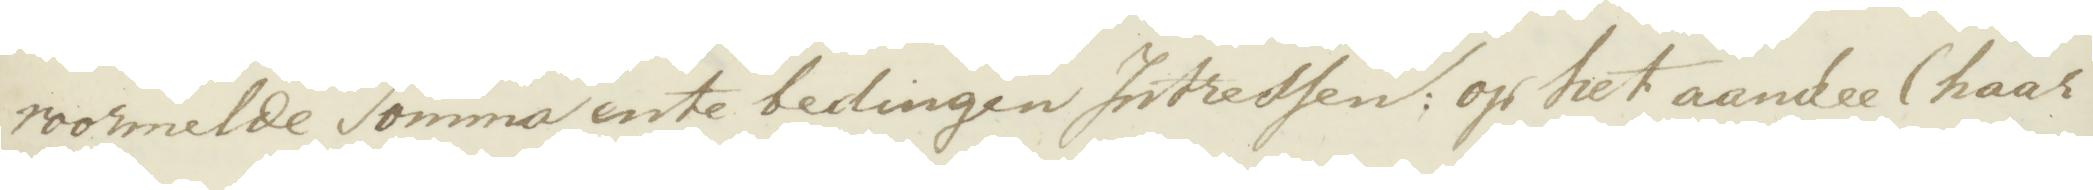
voormelde somma, en te bedingen Jntressen: op het aandeel haar
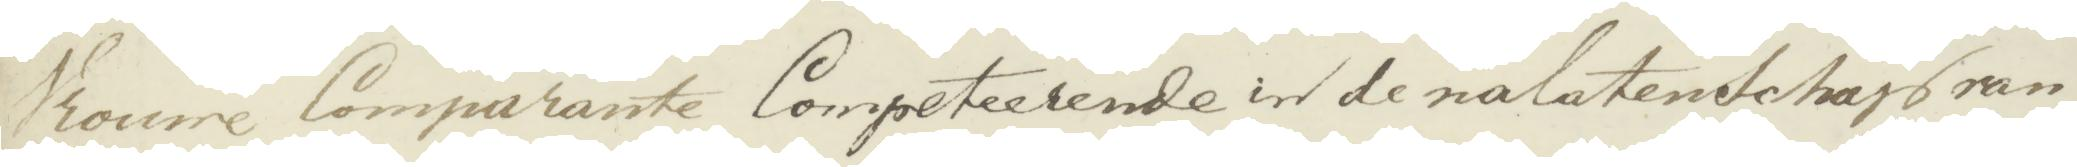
Vrouwe Comparante Competeerende in de nalatenschap van
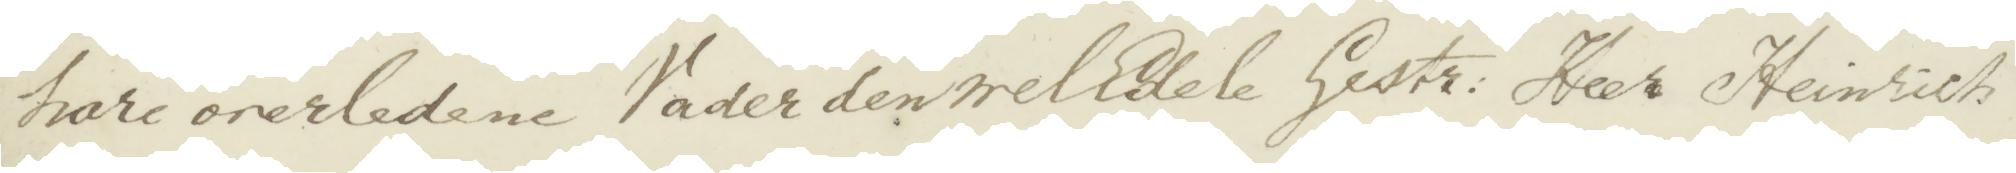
hare overledene Vader den wel Edele Gestr: Heer Heinrich
